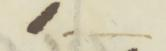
1.-
